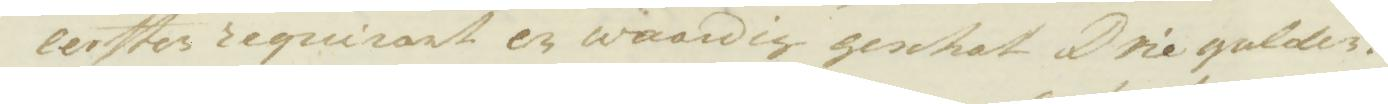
eersten requirant en waardig geschat Drie gulden.
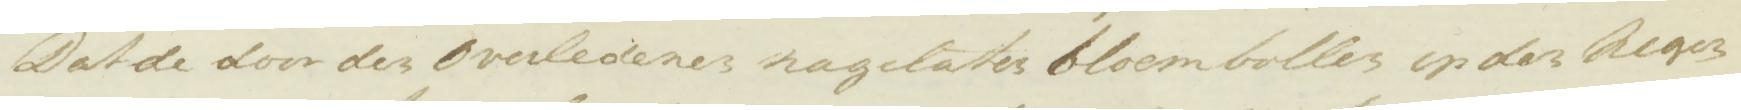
Dat de door den overledenen nagelaten bloembollen in den Negen
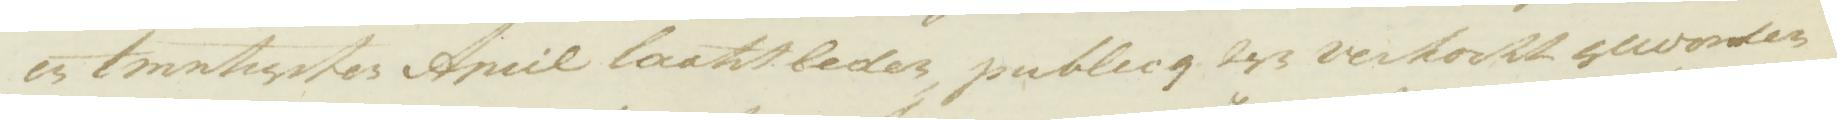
en twintigsten April laatstleden, publicq zyn verkocht geworden
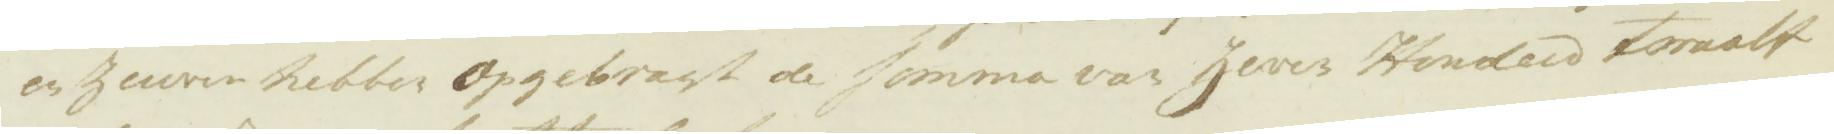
en zuiver hebben opgebragt de somma van Zeven Honderd twaalf
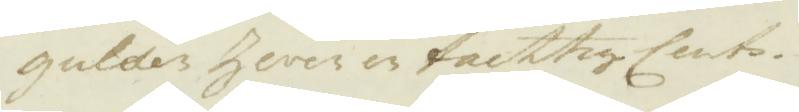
gulden Zeven en tachtig Cents.
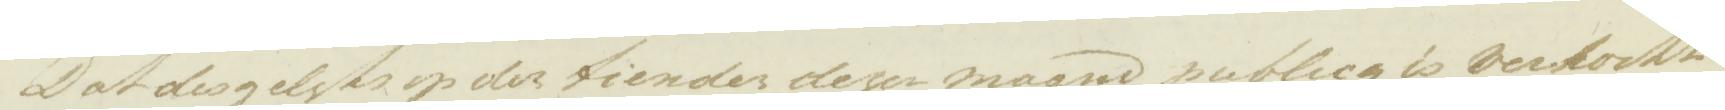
Dat desgelyks op den tienden dezer maand, publicq is verkocht
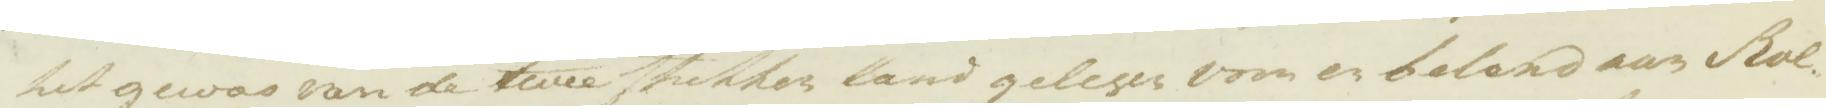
het gewas van de twee stukken land gelegen voor en belend aan Bol„
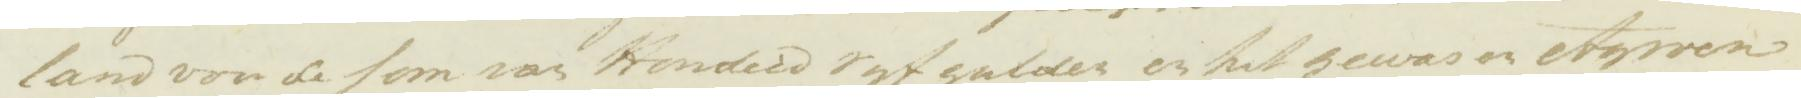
land voor de som van Honderd Vyf gulden en het gewas en Atgwen
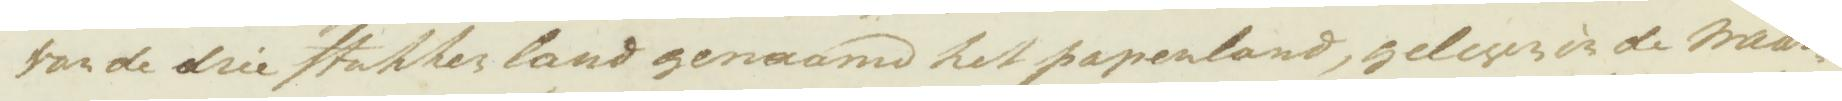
van de drie stukken land genaamd het papenland, gelegen in de waar„
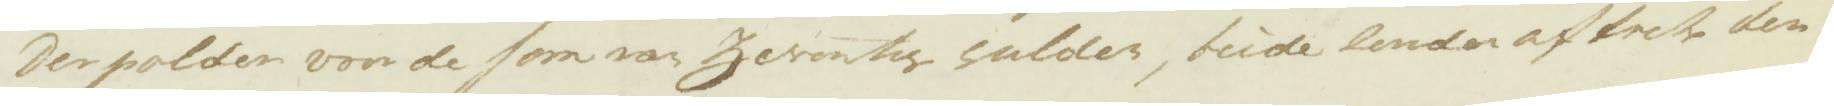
derpolder voor de som van Zeventig gulden, beide zonder aftrek der
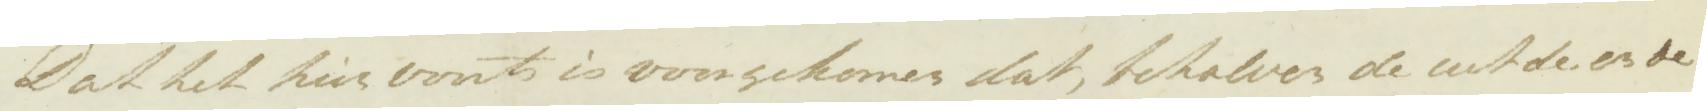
Dat het hier voorts is voorgekomen dat, behalven de uit de in de
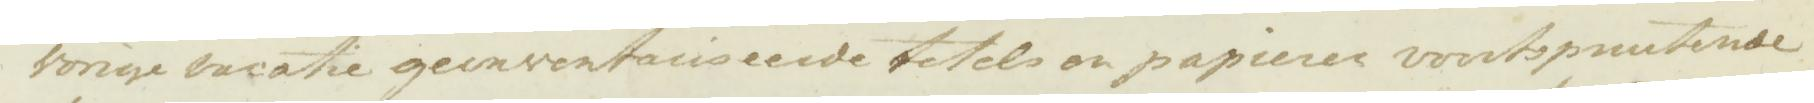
vorige vacatie geinventariseerde titels en papieren voortspruitende
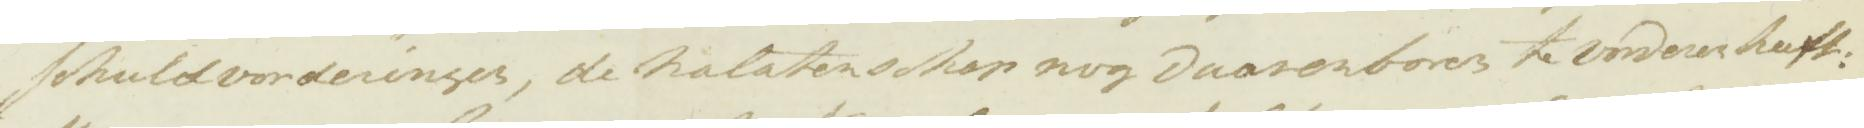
schuld vorderingen, de nalatenschap nog daarenboven te vorderen heeft:
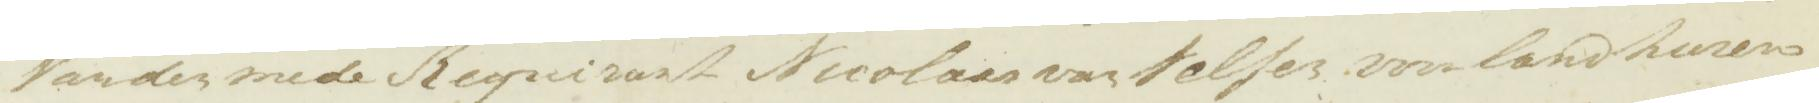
van den mede Requirant Nicolaas van Velsen, voor land huren
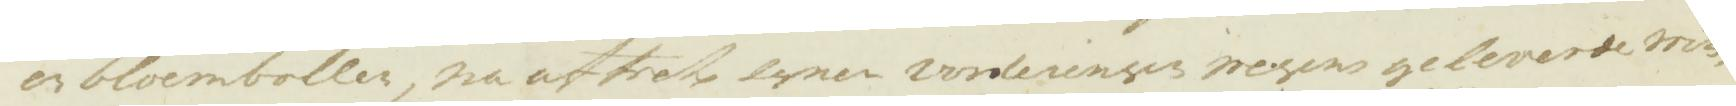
en bloembollen, na aftrek zyner vorderingen wegens geleverde win„
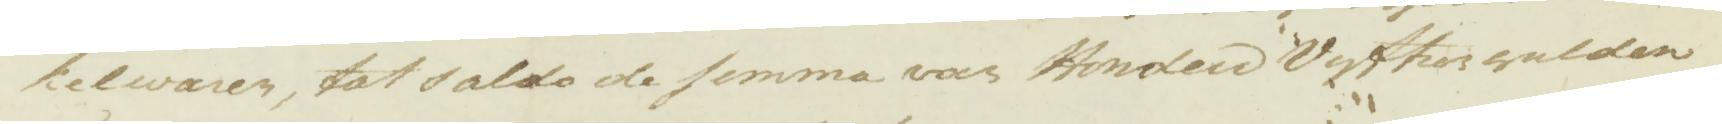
kelwaren, tot saldo de somma van Honderd Vyftien gulden
